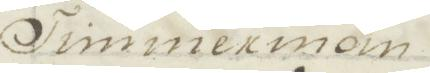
Timmerman
